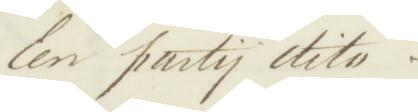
Een partij dito
